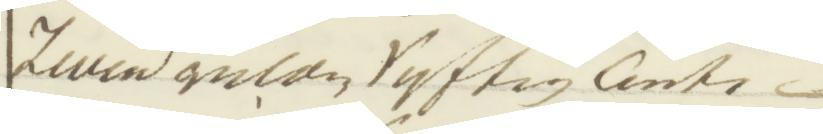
Zeven gulden Vyftig Cents
